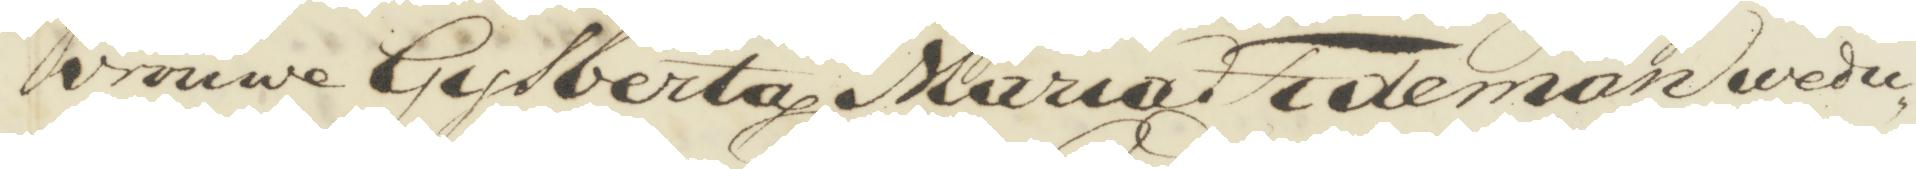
vrouwe Gysberta Maria Tideman wedu„
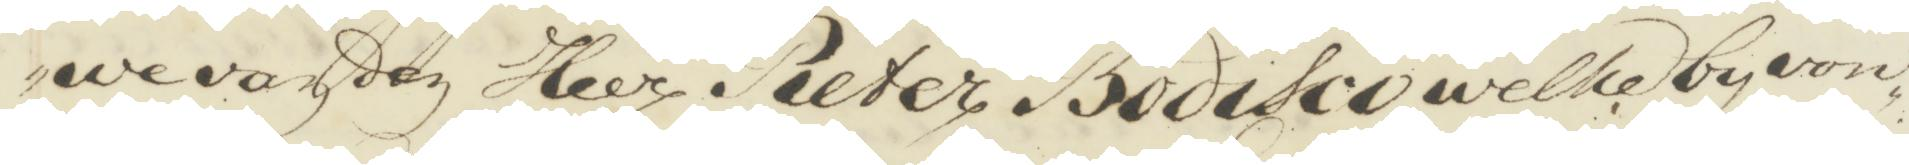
„we van den Heer Pieter Bodisco welke by von„
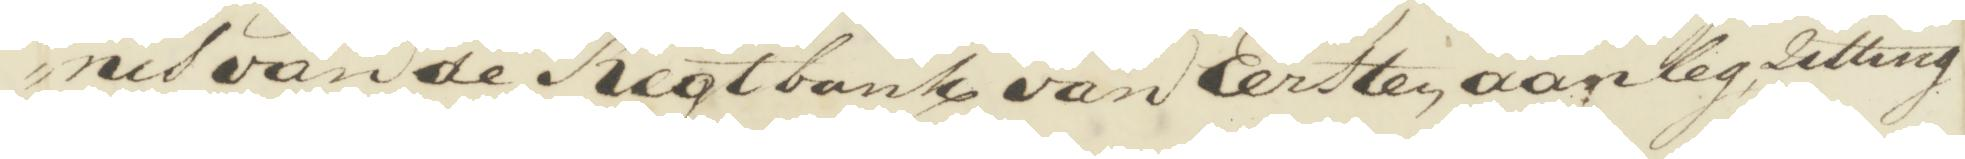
„nis van de Regtbank van Eersten aanleg, zitting
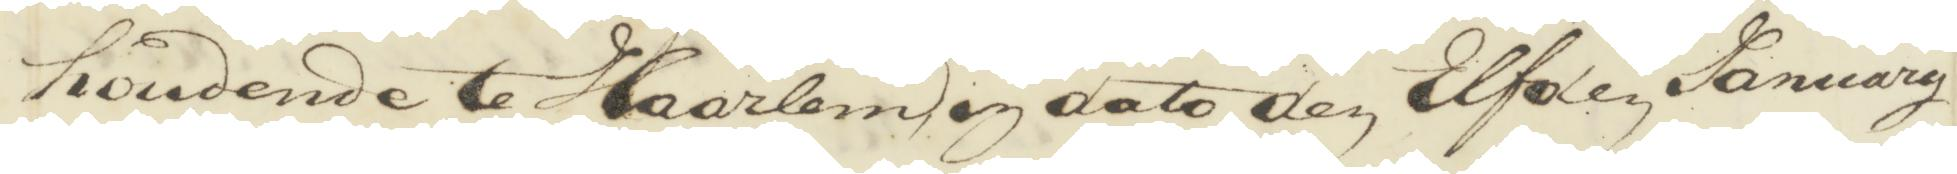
houdende te Haarlem, in dato den Elfden Ianuary
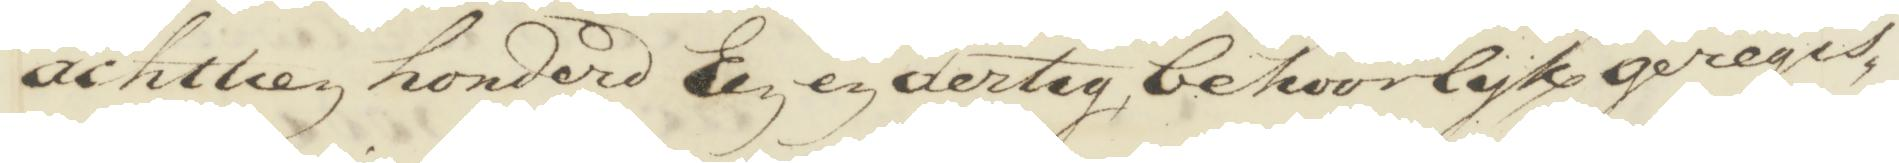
achttien honderd Een en dertig, behoorlijk geregis„
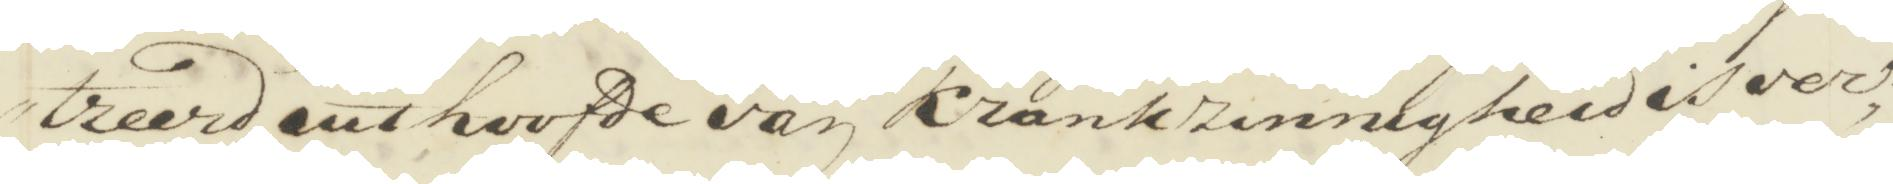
„treerd, uit hoofde van Krankzinnigheid is ver„
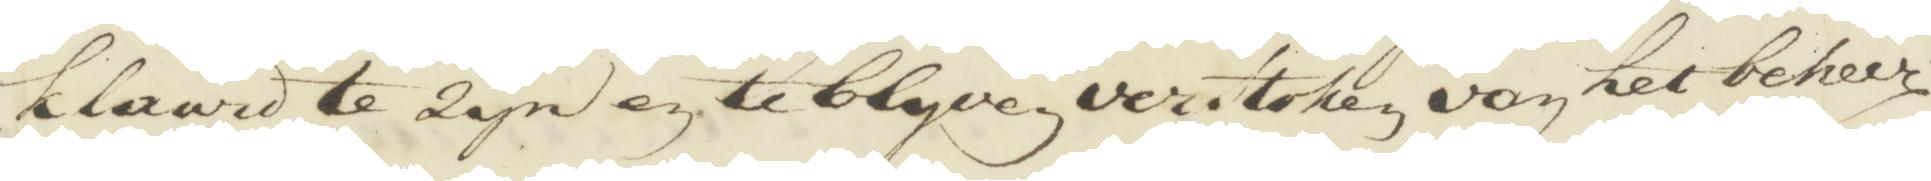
klaard te zyn en te blyven verstoken van het beheer
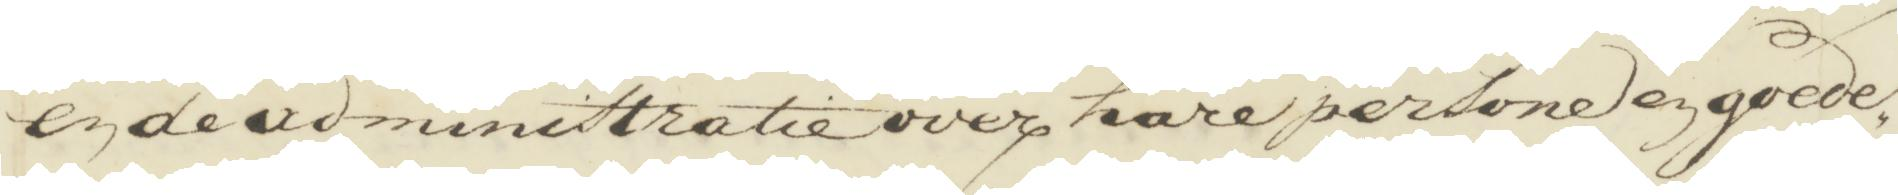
en de administratie over hare persone en goede„
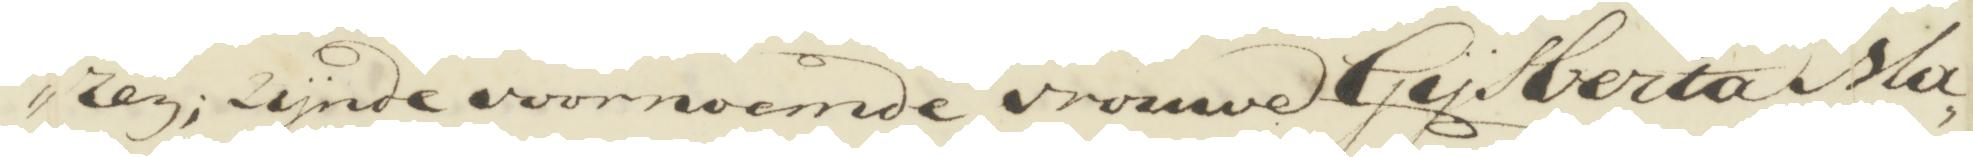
„ren; zijnde voornoemde vrouwe Gijsberta Ma„
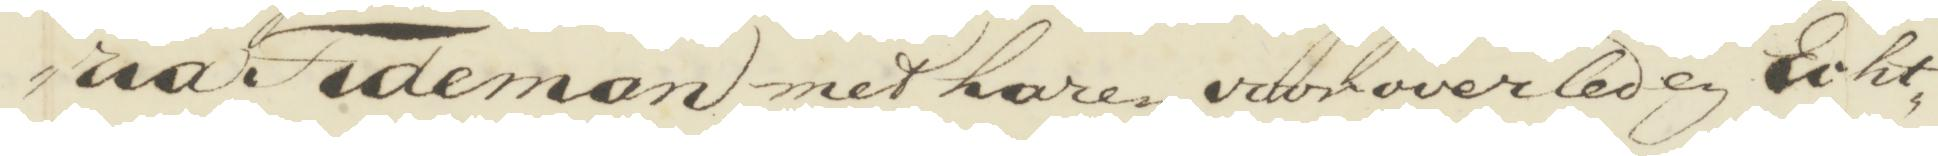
„ria Tidemen met haren vooroverleden Echt„
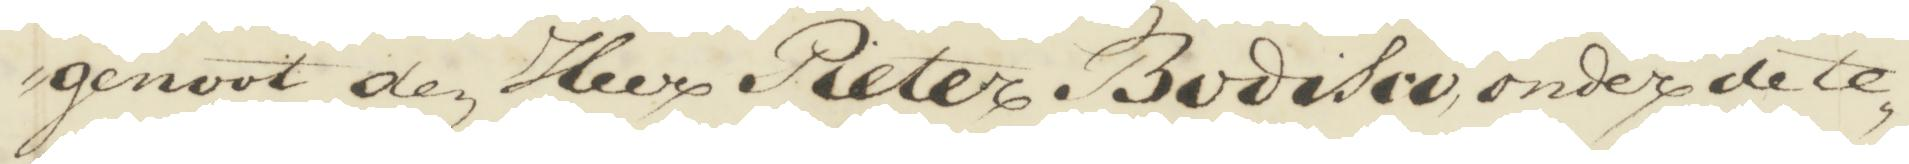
„genoot den Heer Pieter Bodisco, onder de te„
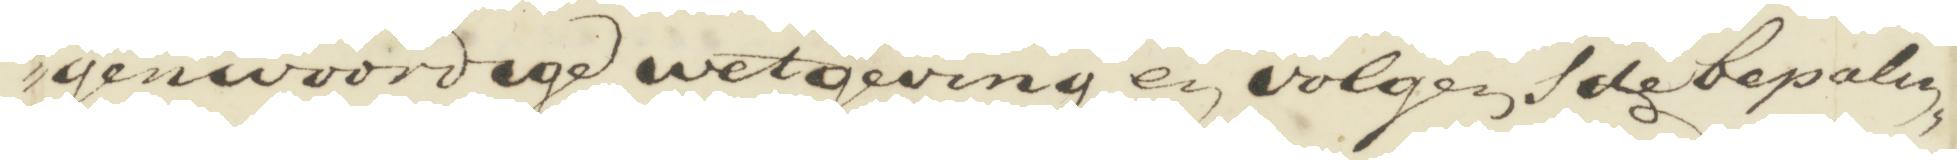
„genwoordige wetgeving en volgens de bepalin„
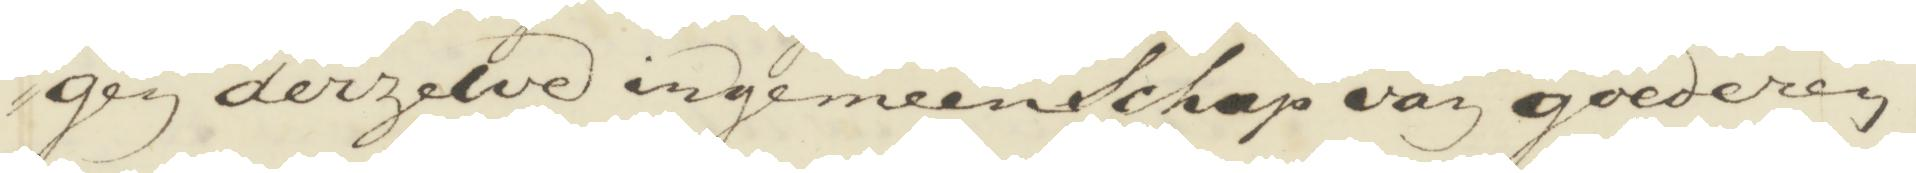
„gen derzelve in gemeenschap van goederen
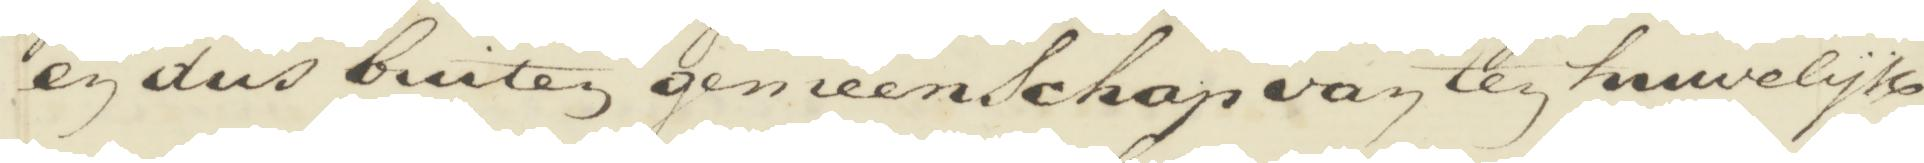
en dus buiten gemeenschap van ten huwelijk
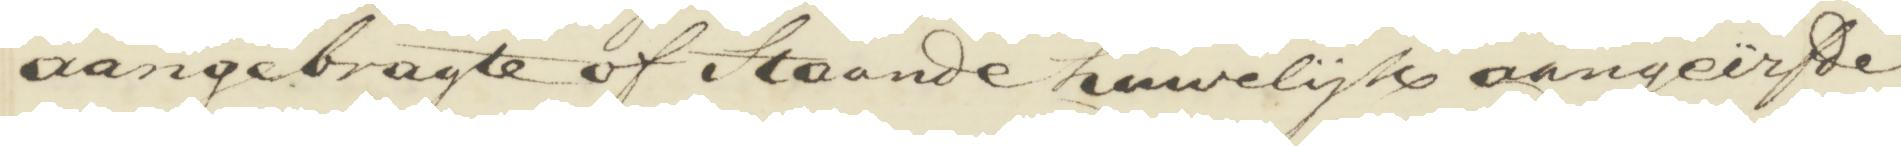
aangebragte of staande huwelijk aangeërfde
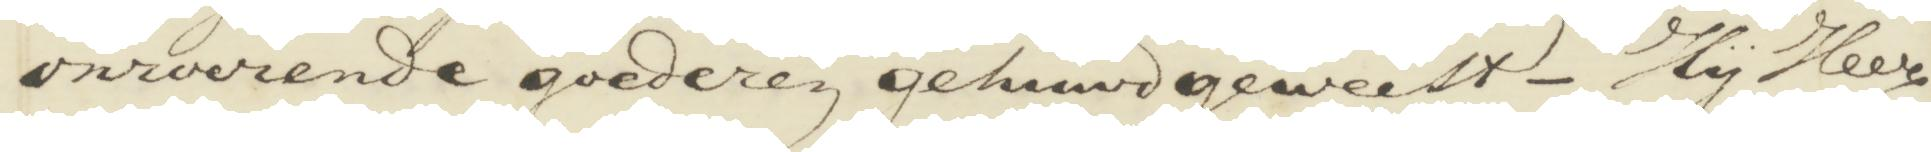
onroerende goederen gehuwd geweest — Hij Heer
